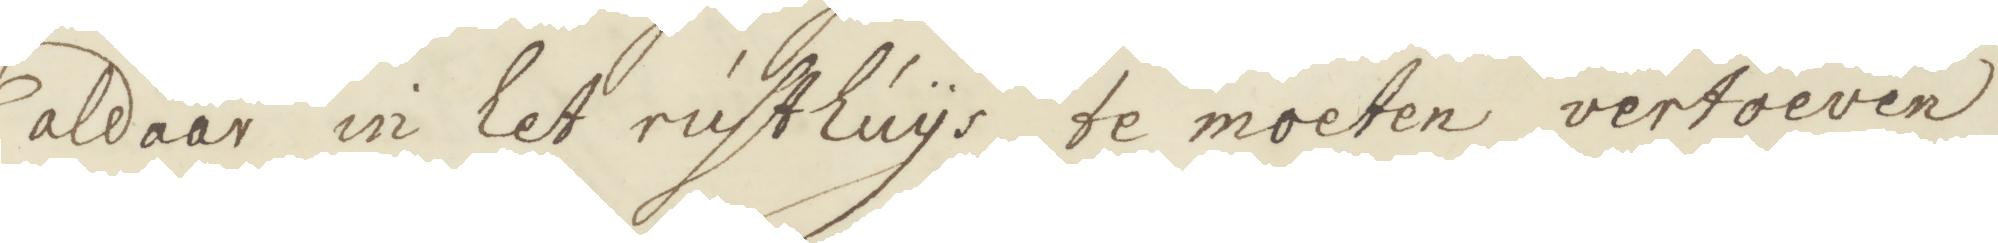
aldaar in het rusthuijs te moeten vertoeven
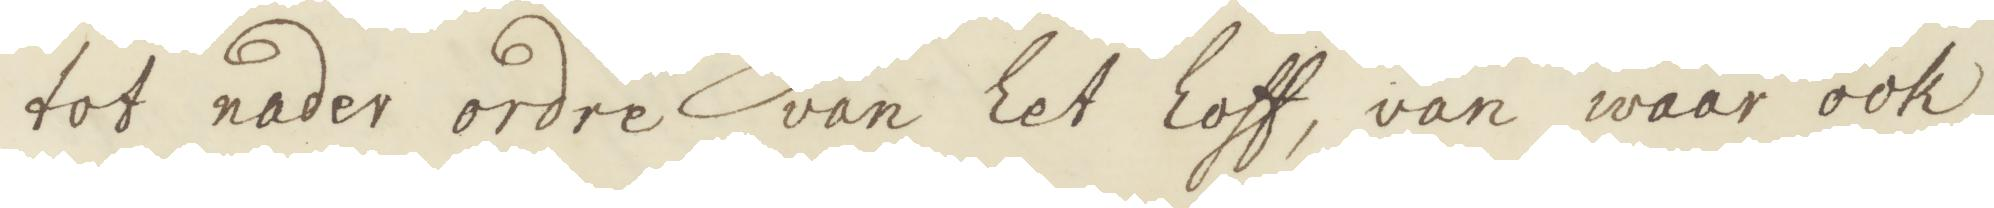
tot nader ordre van het hoff, van waar ook
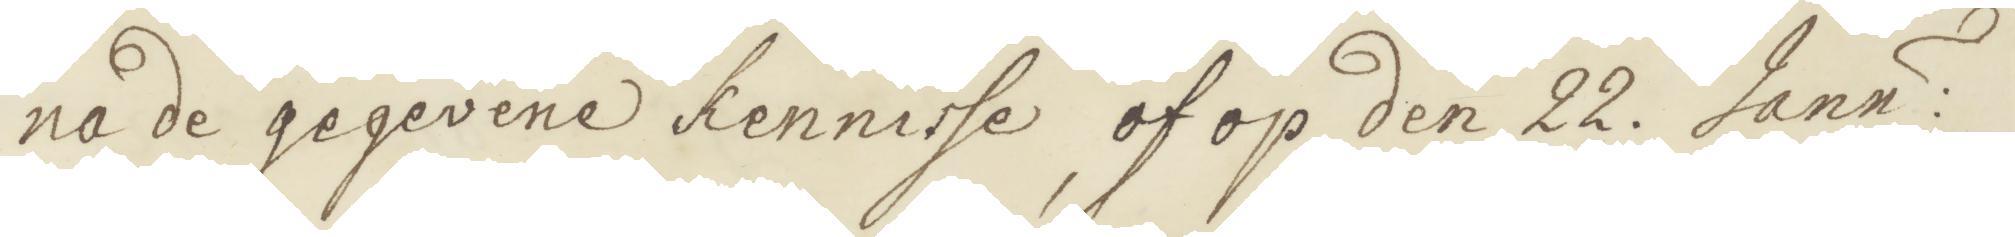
na de gegevene kennisse of op den 22. Jann:
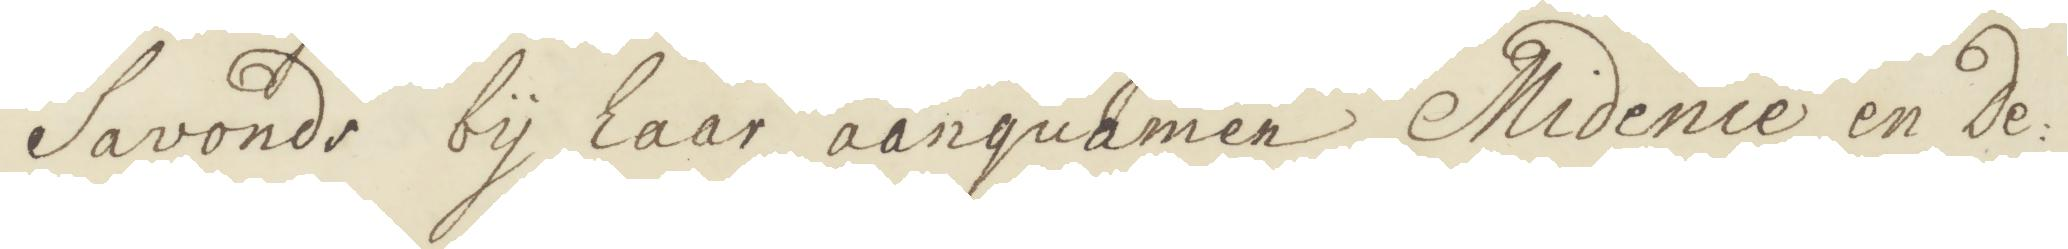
'savonds bij haar aanquamen Midenie en de:
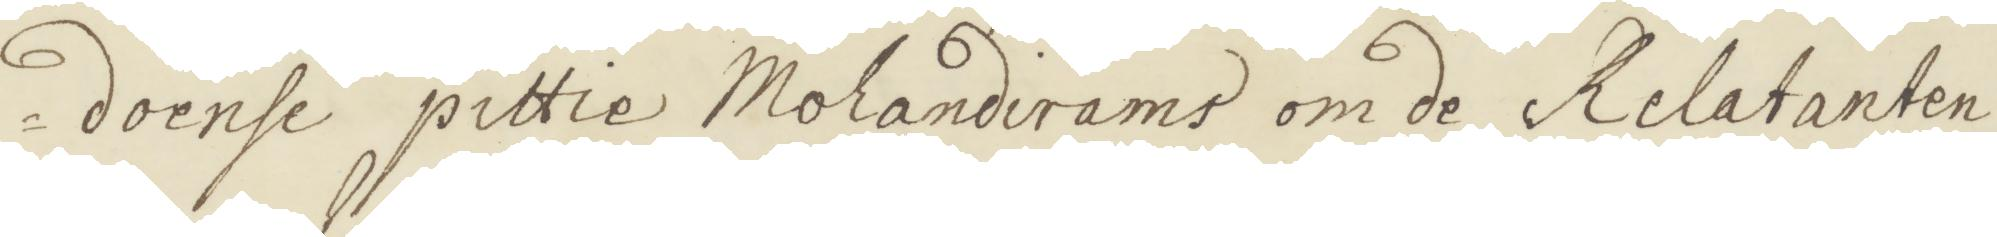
=doense pittie Mohandirams om de Relatanten
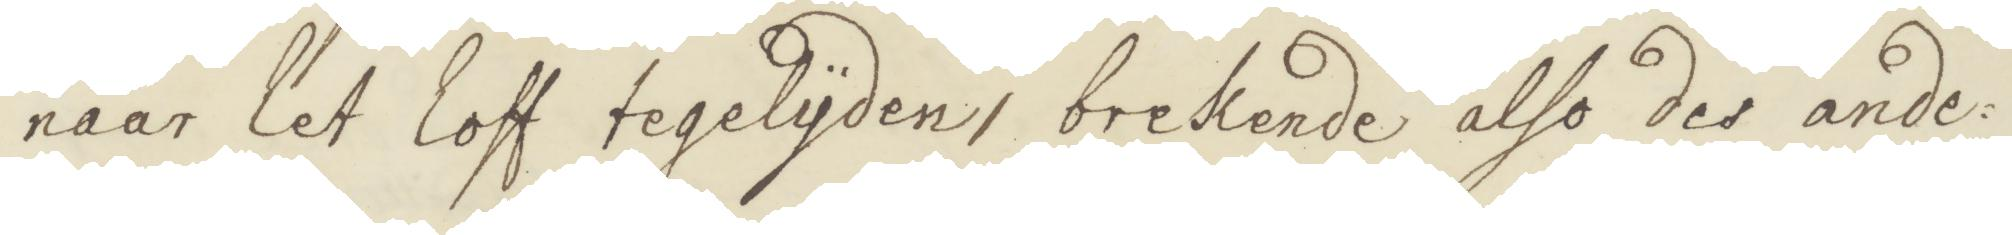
naar het hoff tegelijden, brekende also des ande=
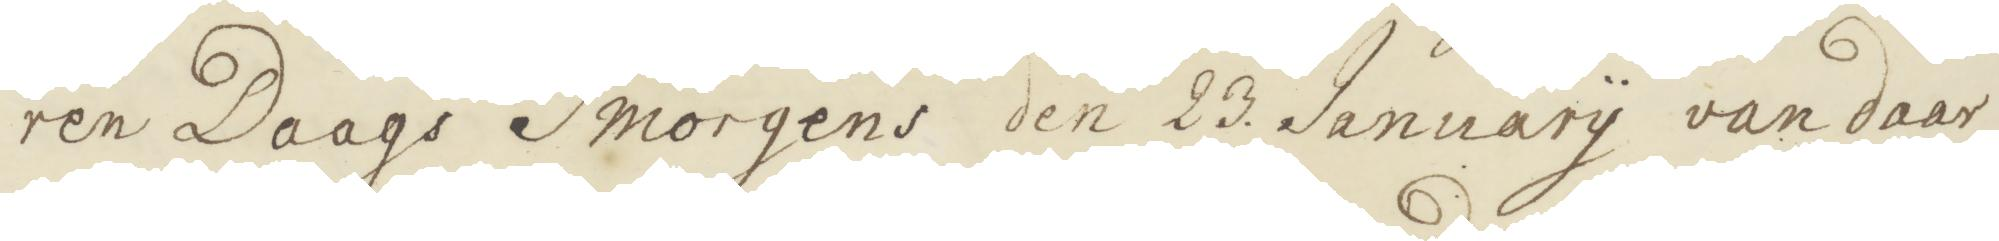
ren Daags 'smorgens den 23. Ianuarij van daar
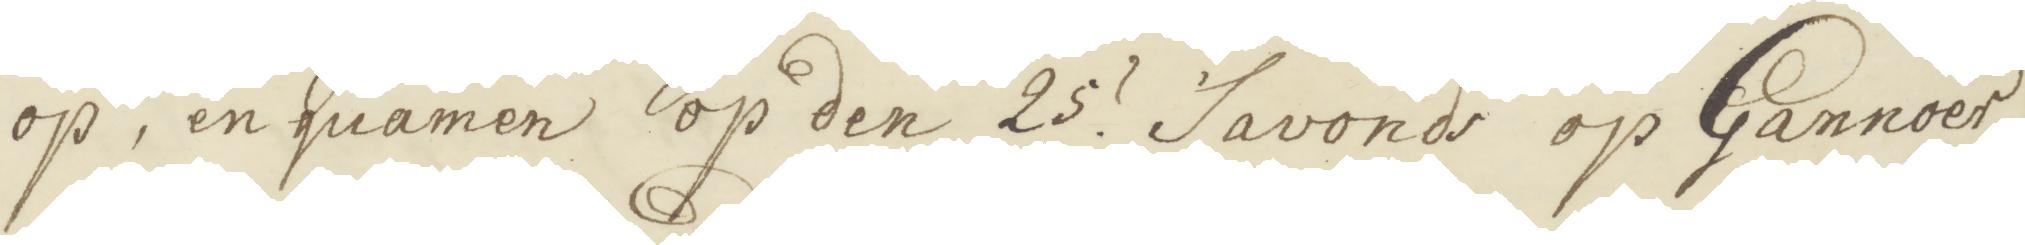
op, en quamen op den 25.' 'savonds op Gannoer,
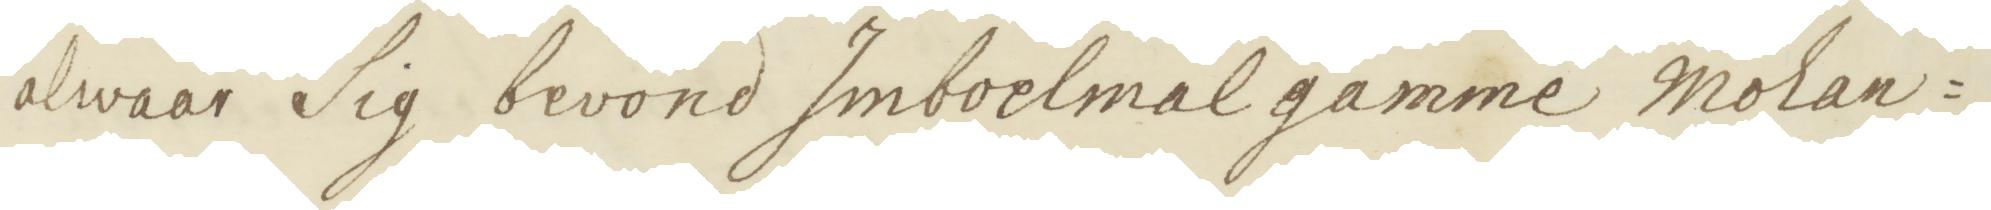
alwaar sig bevond Jmboelmal gamme mohan=
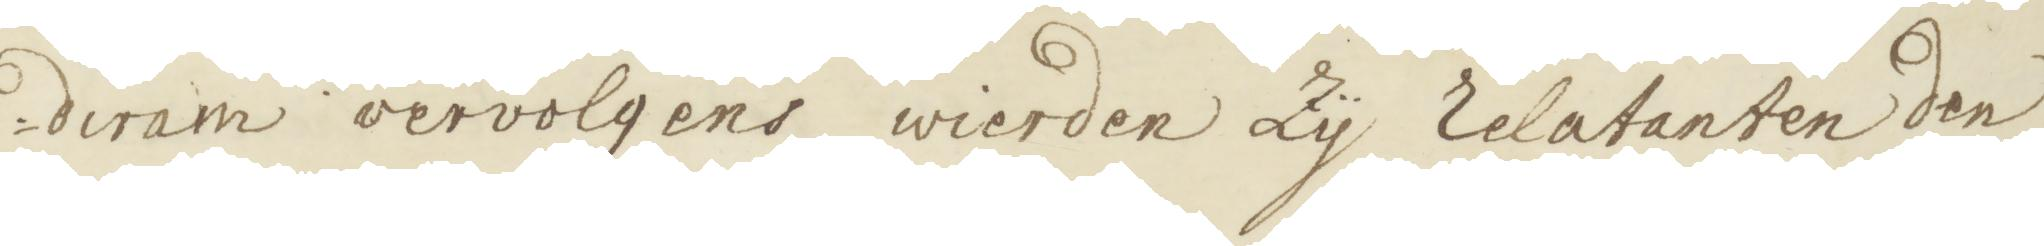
=diram vervolgens wierden zij relatanten den
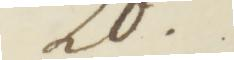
26.'
